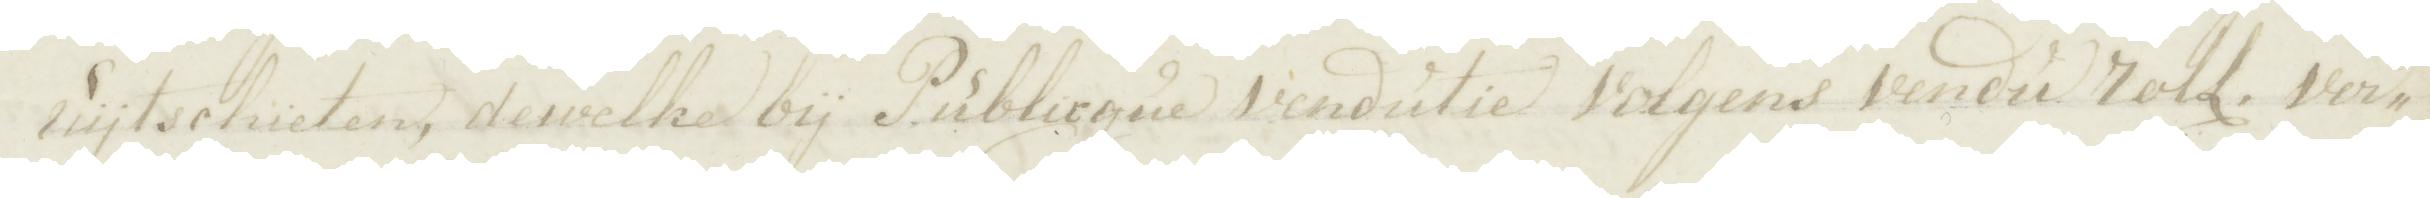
uijtschieten, dewelke bij Publicque vendutie volgens vendu Roll. ver„
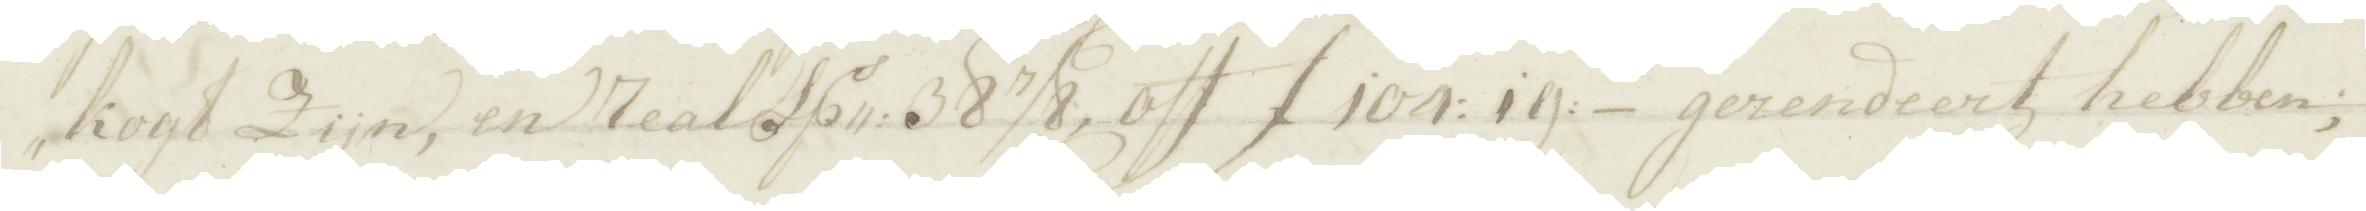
„kogt Zijn, en Real Sp„s 38 7/8, off ƒ 104: 19: — gerendeert hebben;
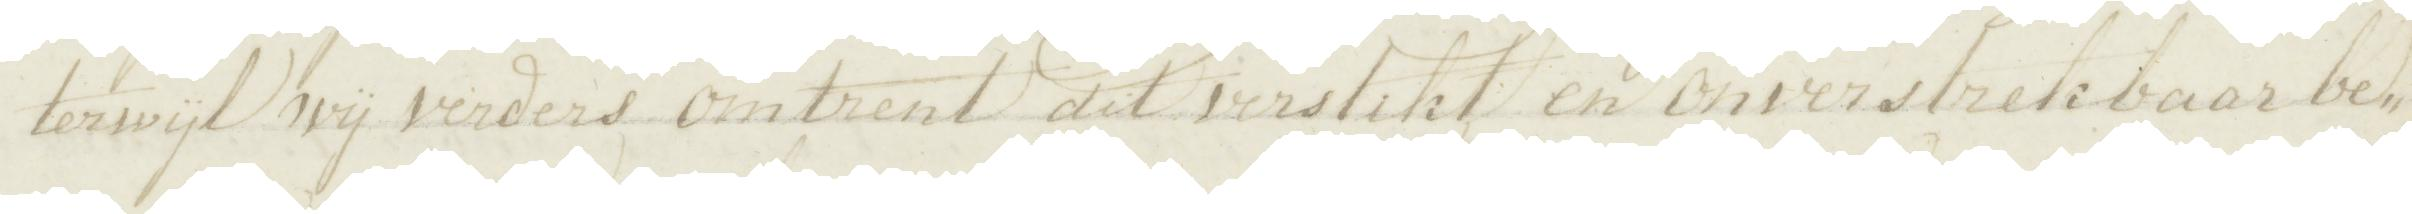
terwijl wij verders omtrent dit verstikt en onverstrekbaar be„
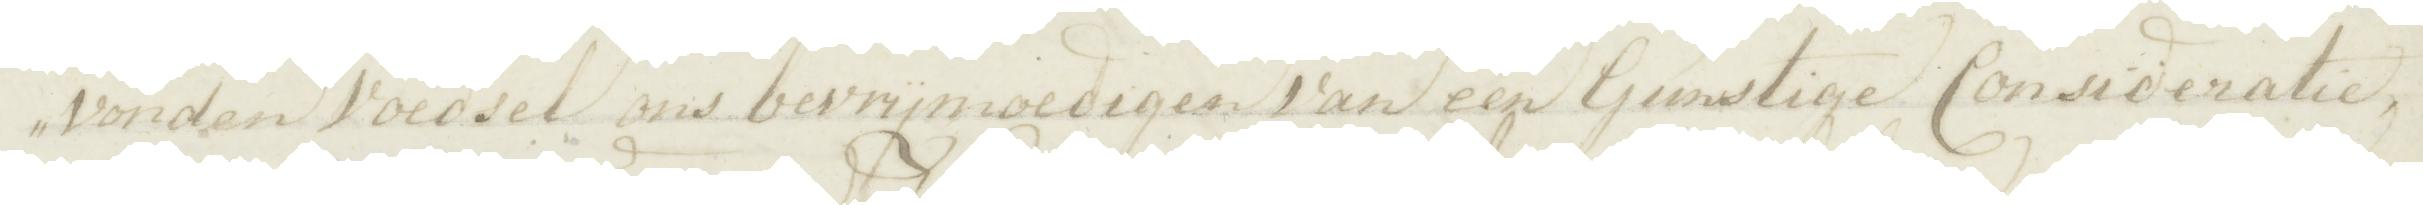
„vonden Voedsel ons bevrijmoedigen van een Gunstige Consideratie,
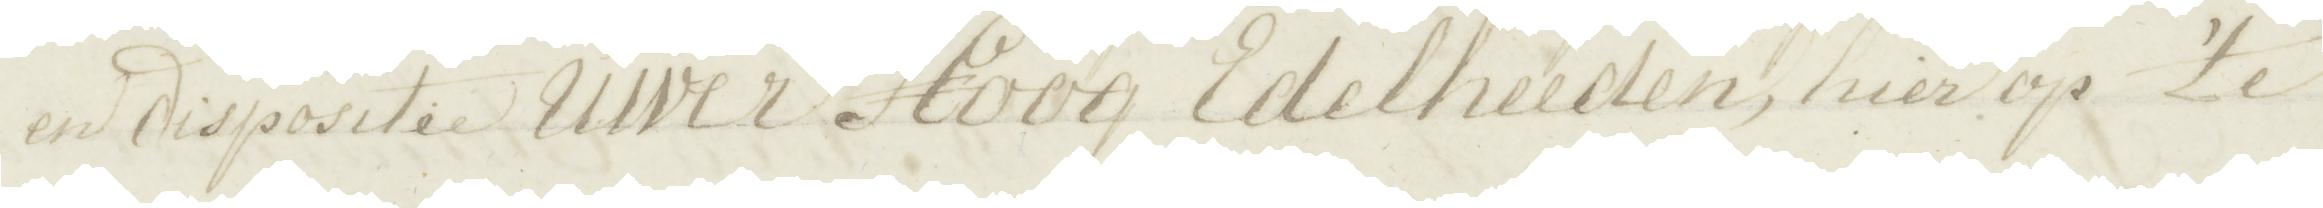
en dispositie Uwer Hoog Edelheeden, hier op 'te
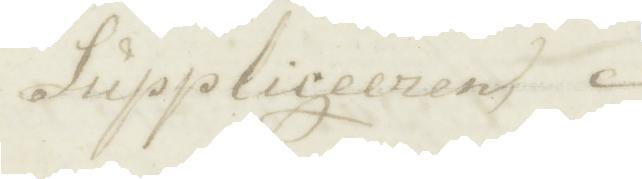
suppliceeren ~
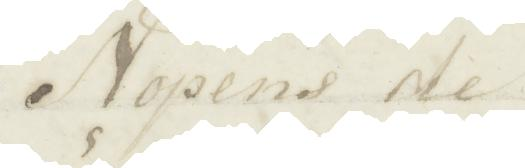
Nopens de
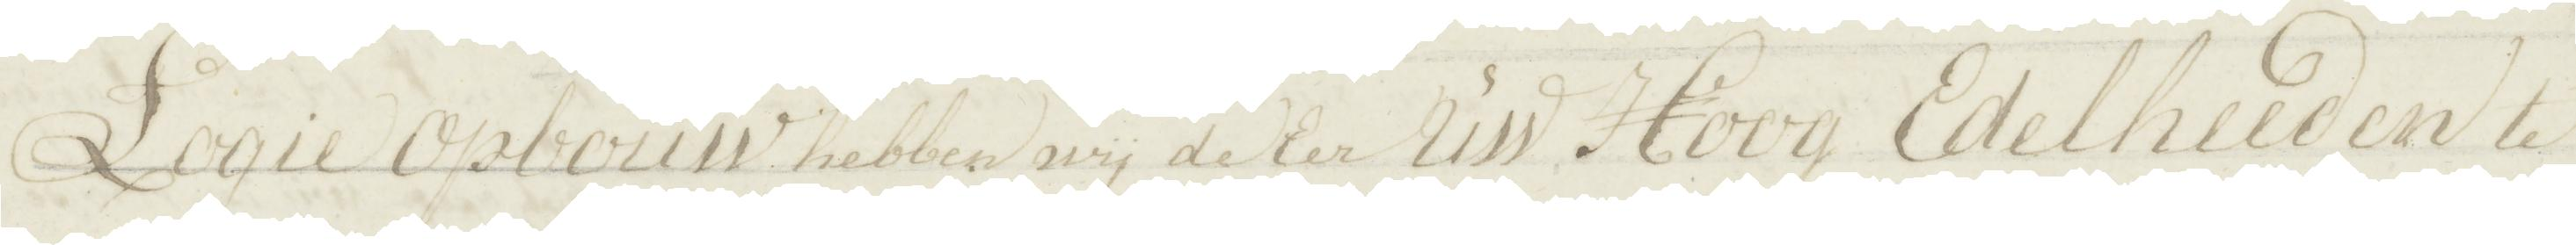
Logie opbouw hebben wij de Eer UW Hoog Edelheeden te
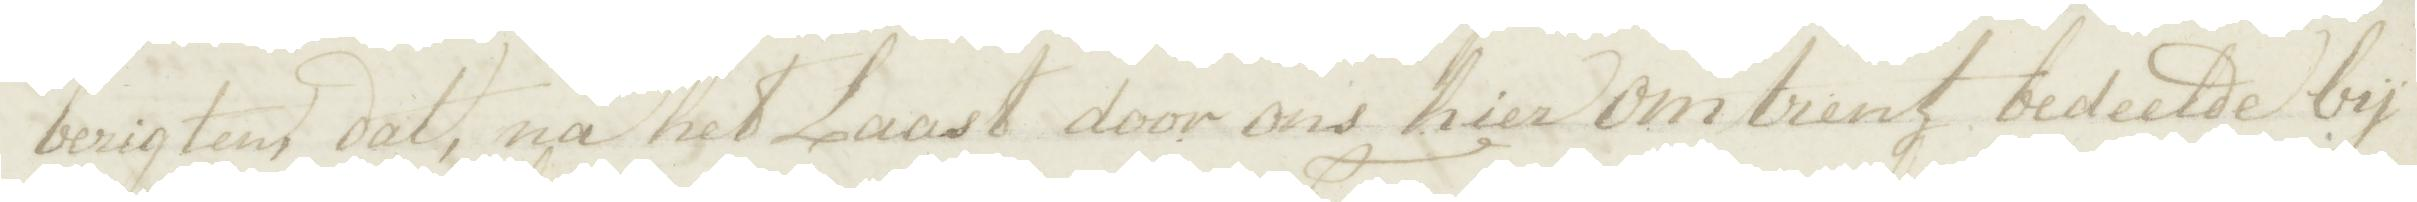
berigten, dat, na het Laast door ons hier omtrent bedeelde bij
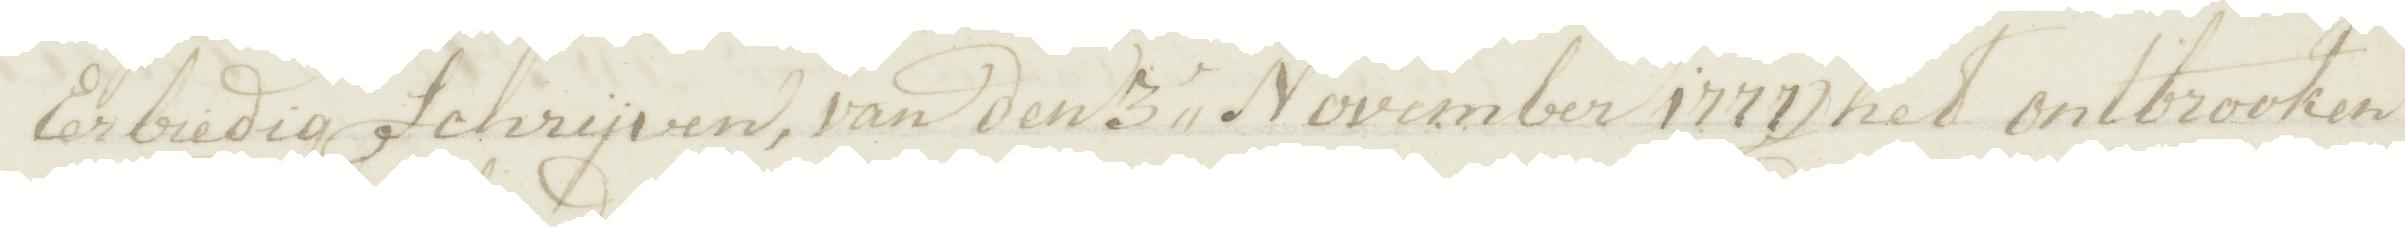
Eerbiedig Schrijven, van den 3„e November 1777 het ontbrooken
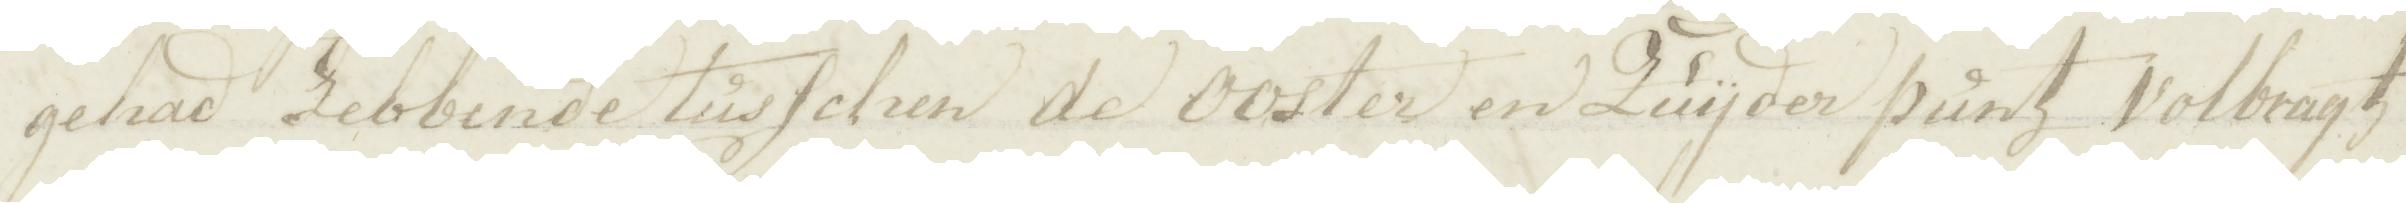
gehad hebbende tusschen de Ooster en Zuijder punt volbragt
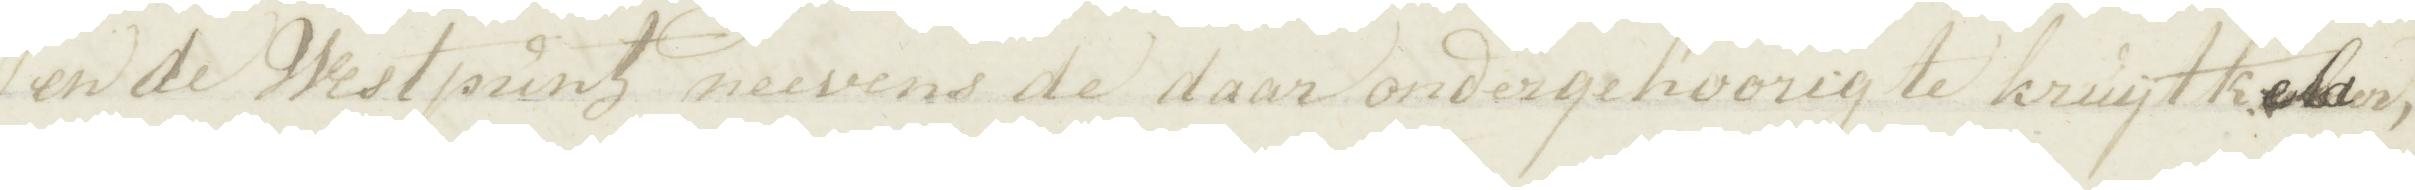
en de Westpunt neevens de daar ondergehoorig te kruijtkelder,
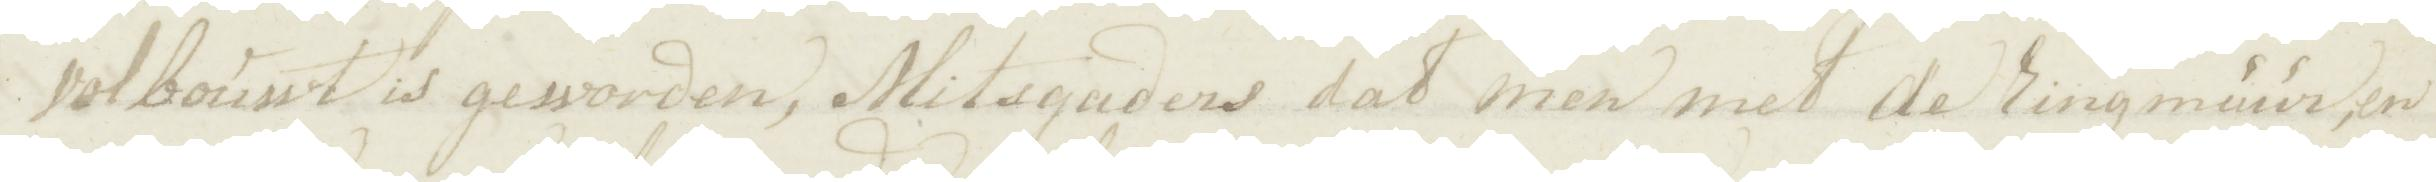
volbouwt is geworden, Mitsgaders dat men met de Ringmuur, en
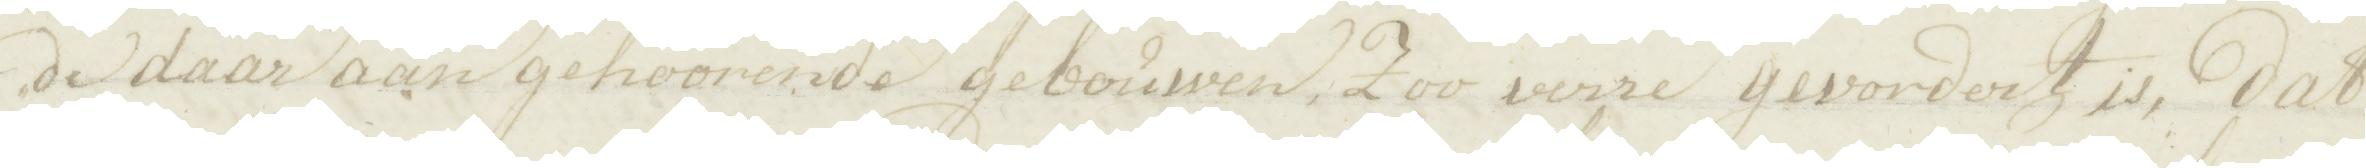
de daar aan gehoorende gebouwen, Zoo verre gevordert is, dat
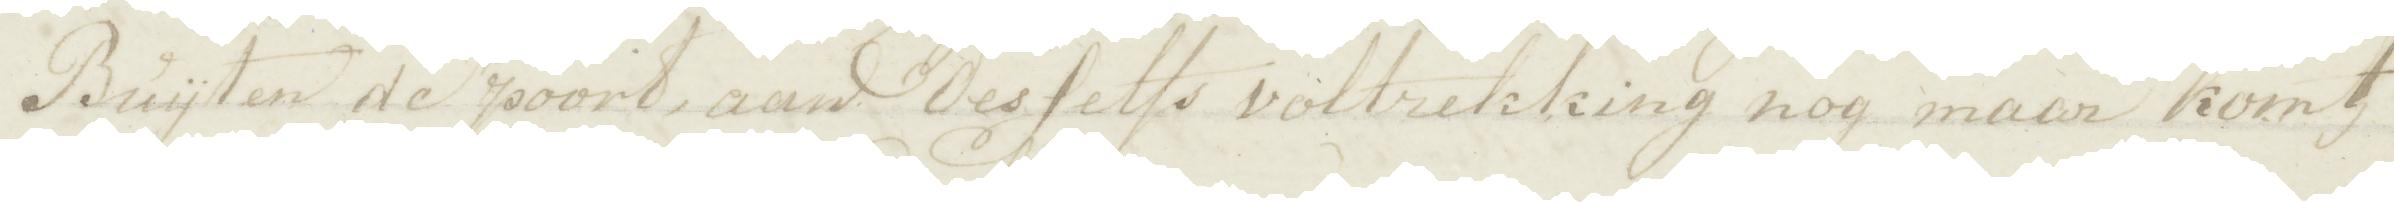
Buijten de poort, aan Desselfs voltrekking nog maar komt
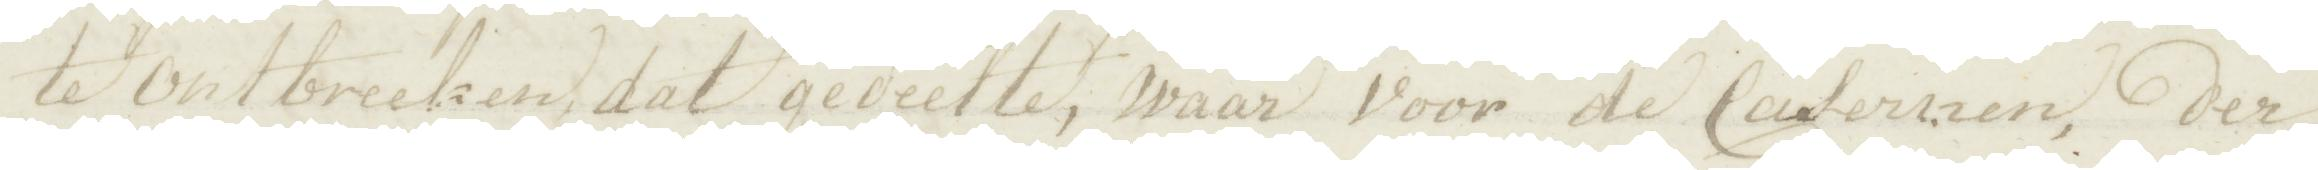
te ontbreeken, dat gedeelte, Waar Voor de Casernen, der
